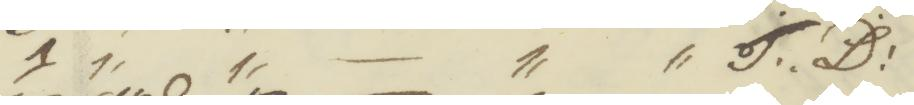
1 „ „ — „ „ T: D:
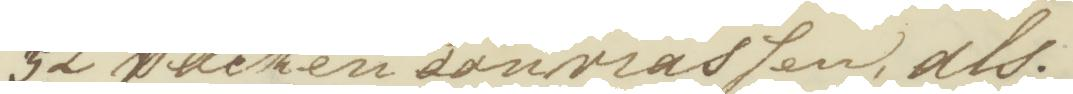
52 packen douviassen, als. —
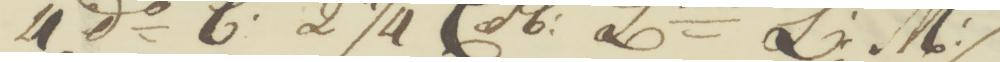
4 d=o b: 2¼ Cob: L=ra L: M:
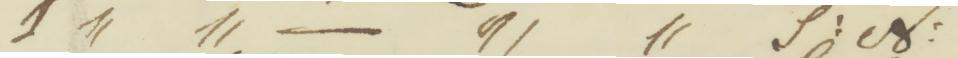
1 „ „ — „ „ S: N:
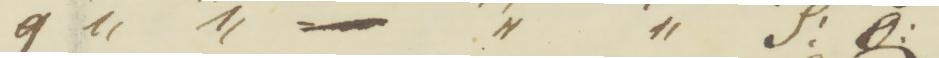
9 „ „ — „ „ S: O:
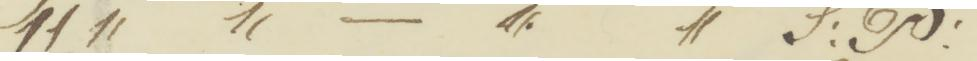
11 „ „ — „ „ S: P:
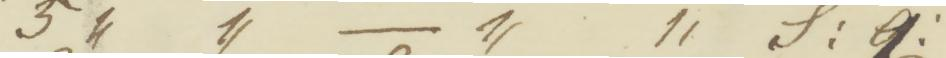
5 „ „ — „ „ S: Q:
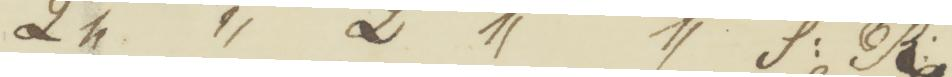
2 „ „ 2 „ „ S: R:
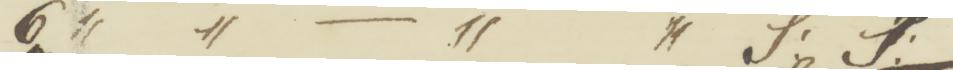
6 „ „ — „ „ S: S:
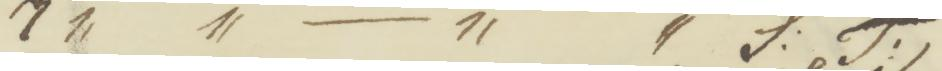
7 „ „ — „ „ S: T:
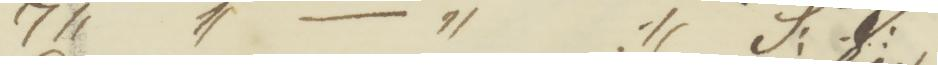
7 „ „ — „ „ S: V:
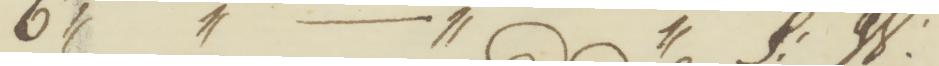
6 „ „ — „ „ S: W:
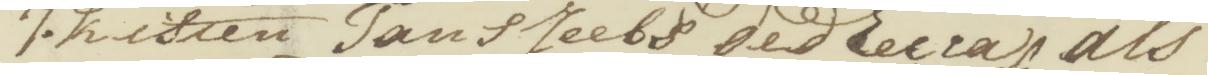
7. kisten Tansjeebs de d hecra, als
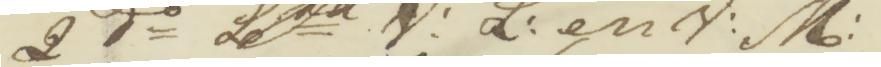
2 d=o L=ra V: L: en V: M:
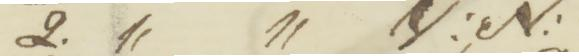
2. „ „ V: N:
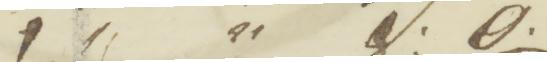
1 „ „ V: O:
